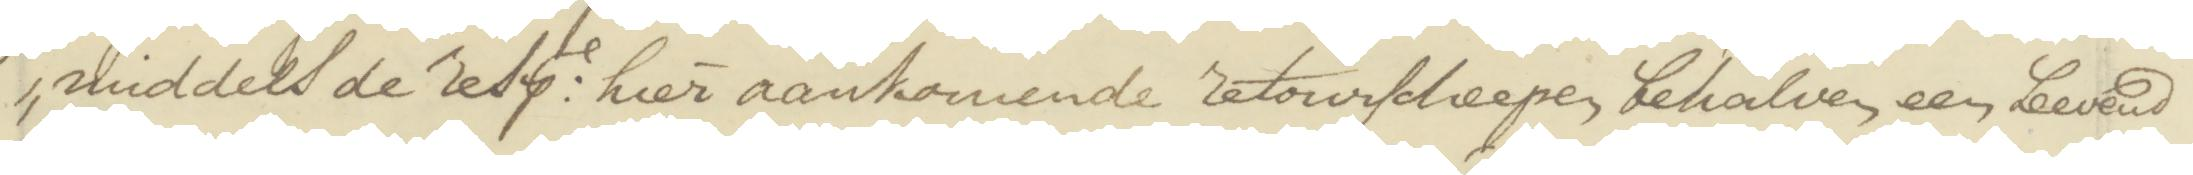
„middels de resp:e hier aankomende retourscheepen behalven een leevend
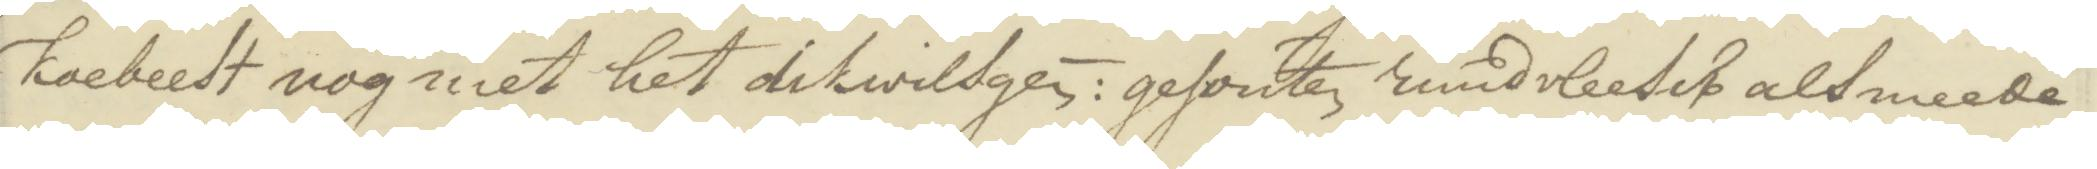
koebeest nog met het dikwils gen: gesouten rund vleesch als meede
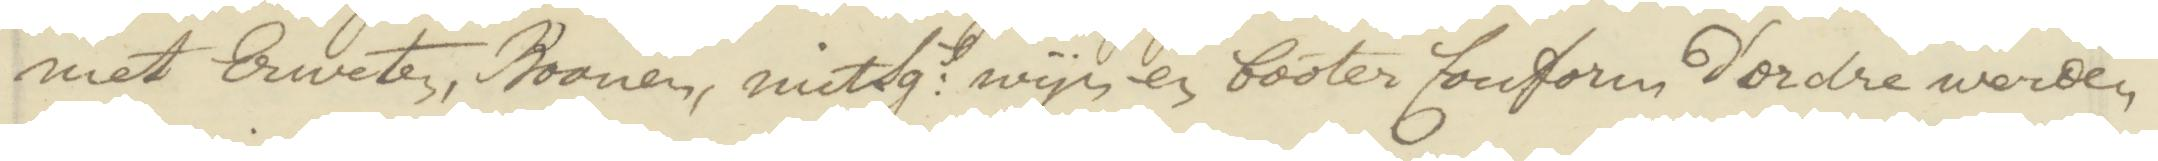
met Erweten, Boonen, mitsg:s wijn en booter Conform d’ordre werden
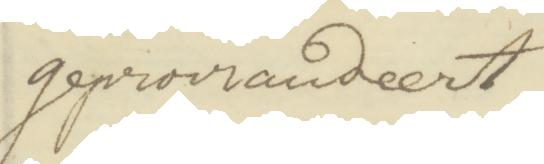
geproviandeert
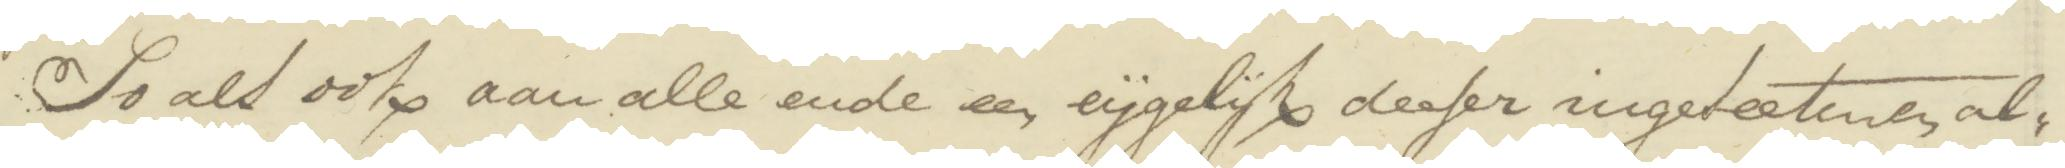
So als ook aan alle ende een eijgelijk deeser ingeseetenen al„
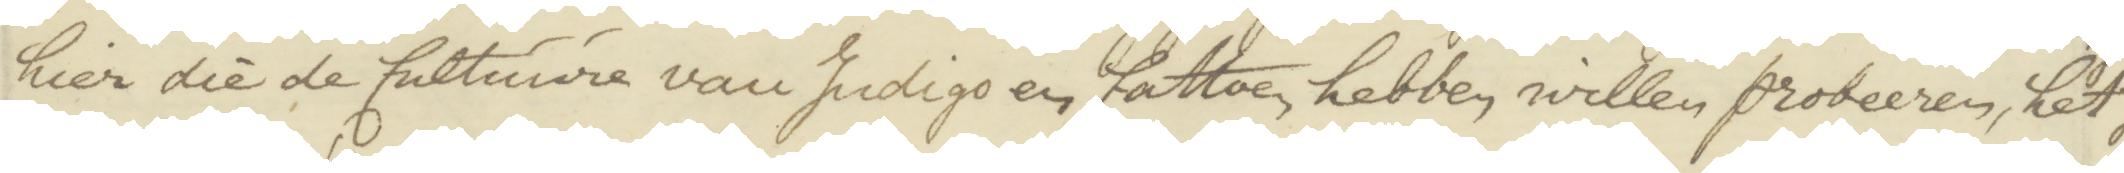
hier die de Cultuure van Jndigo en Cattoen hebben willen proteeren, het
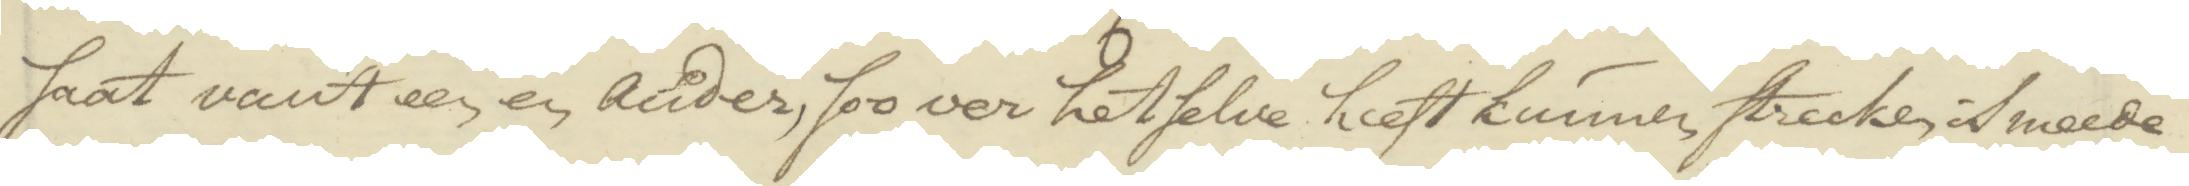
saat van’t een en ander, soo ver hetselve heeft kunnen strecken is meede
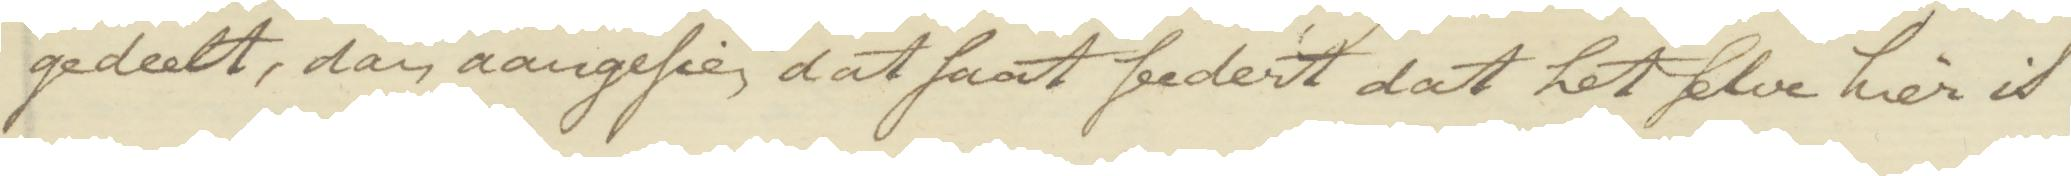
gedeelt, dan aangesien dat saat sedert dat het selve hier is
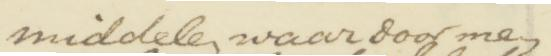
middelen waar door men
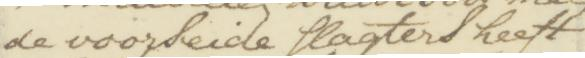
de voorseide slagters heeft
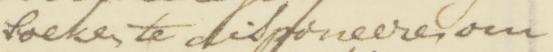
soeken te disponeere om
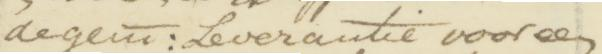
de gem: Leverantie voor een
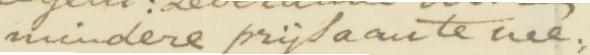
mindere prijs aan te nee„
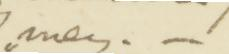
„men. —
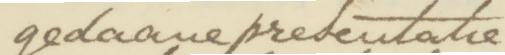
gedaane presentatie
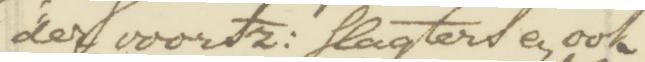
der voorsz: slagters en ook
